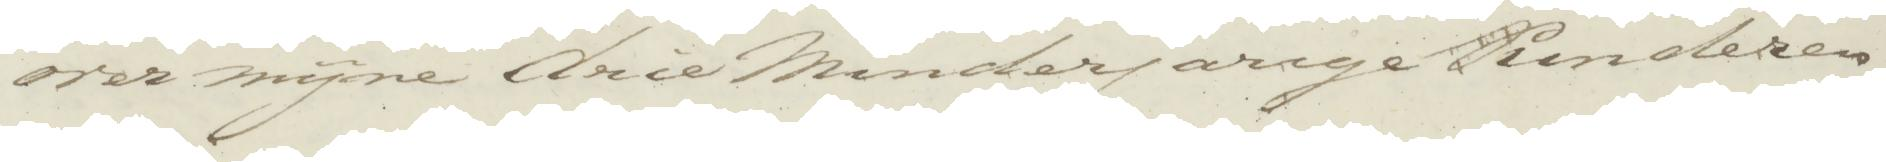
over mijne drie minderjarige Kinderen,
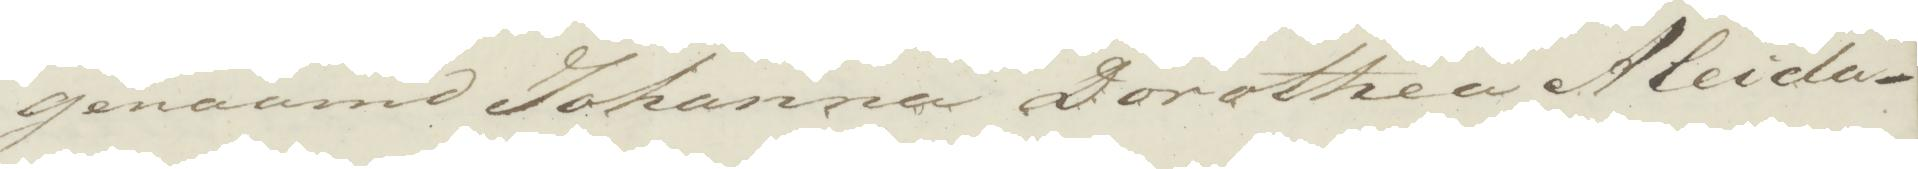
genaamd Johanna Dorothea Aleida_
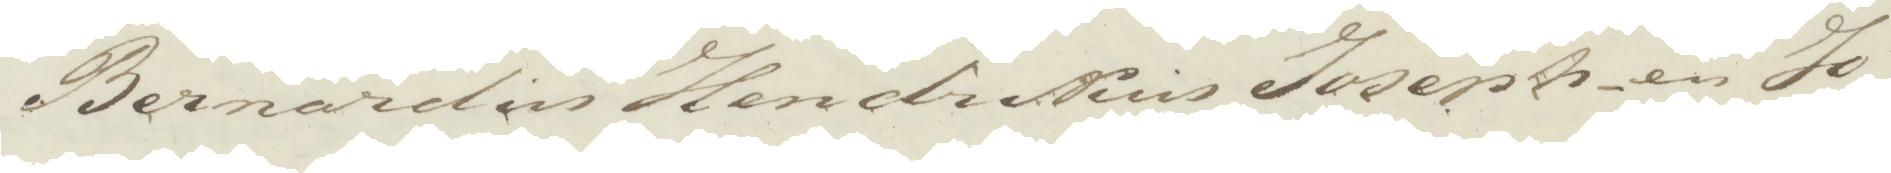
Bernardus Hendrikus Joseph _ en Jo
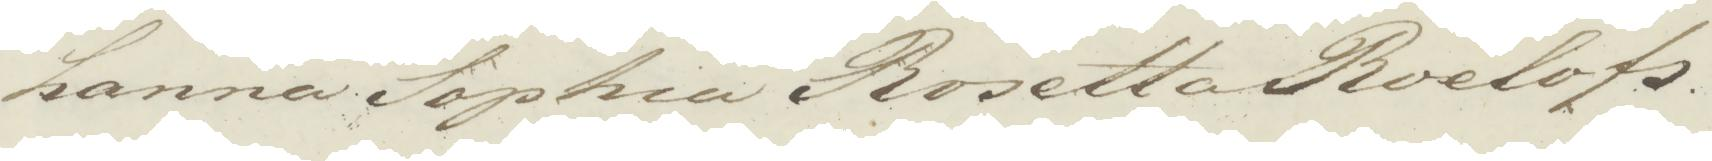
hanna Sophia Rosetta Roelofs.
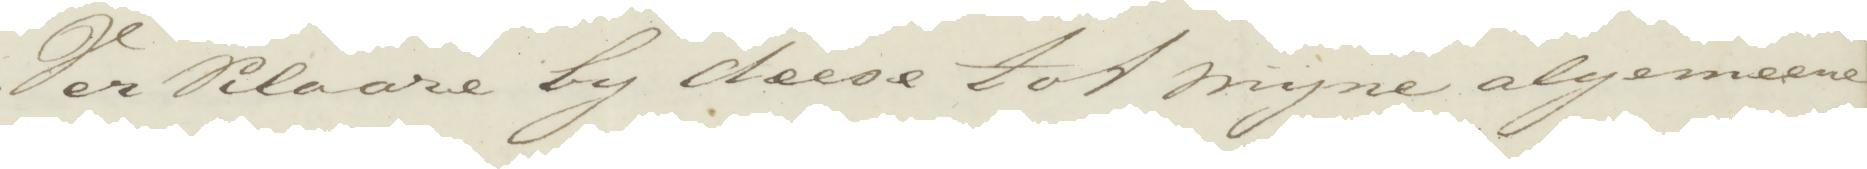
Verklaare by deese tot mijne algemeene
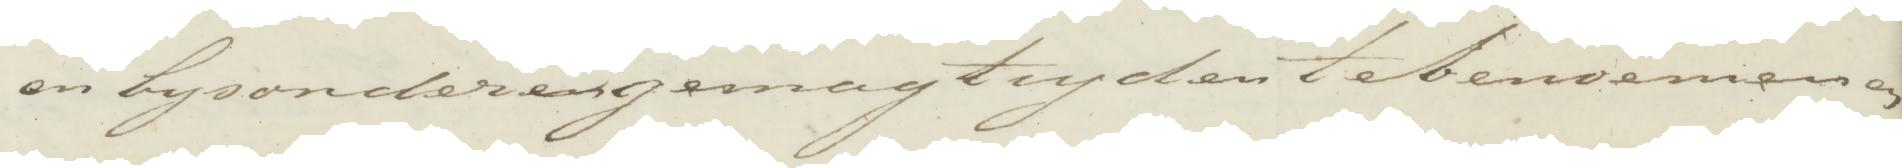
en bysonderen gemagtigden te benoemen e
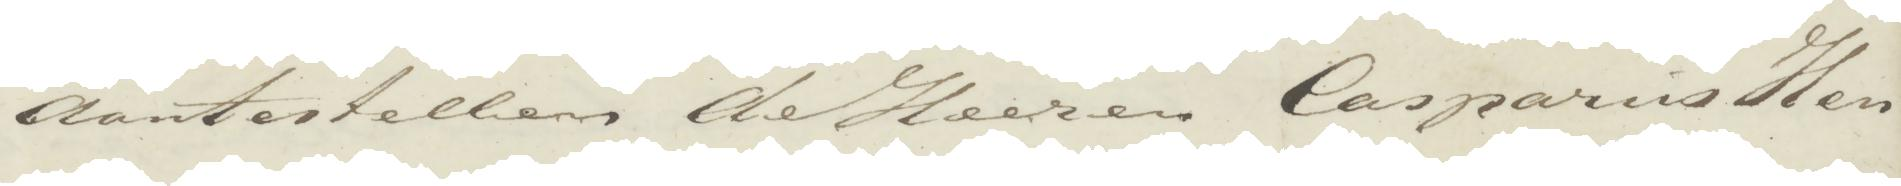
aantestellen de Heeren Casparus Hen
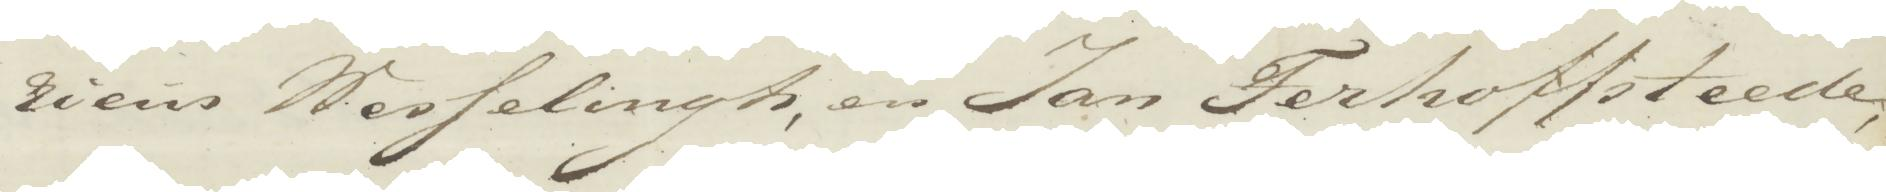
ricus Wesselingh, en Jan Terhoffsteede,
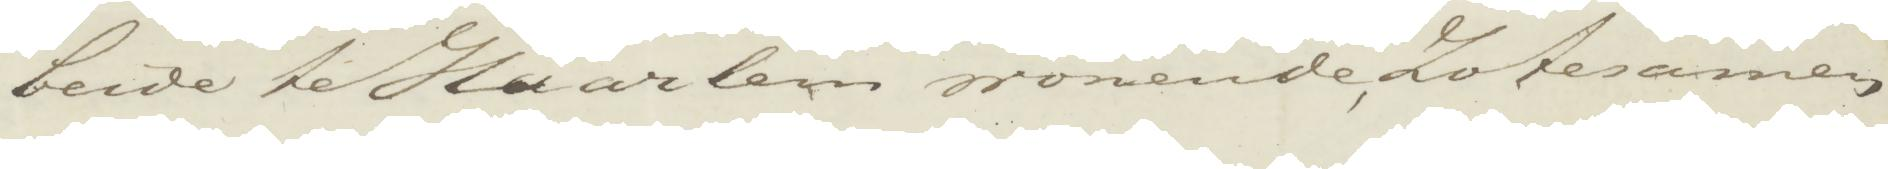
beide te Haarlem wonende, Zo tesamen
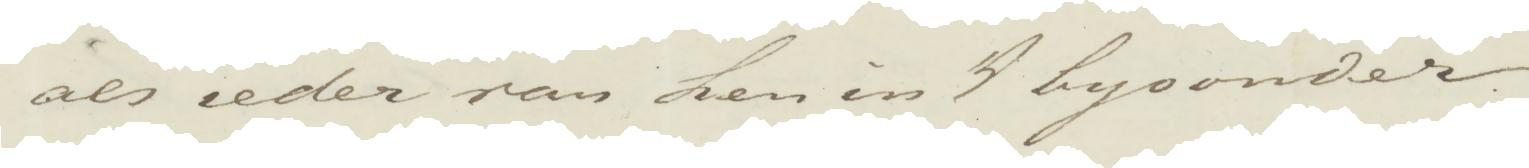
als ieder van hen in 't bysonder
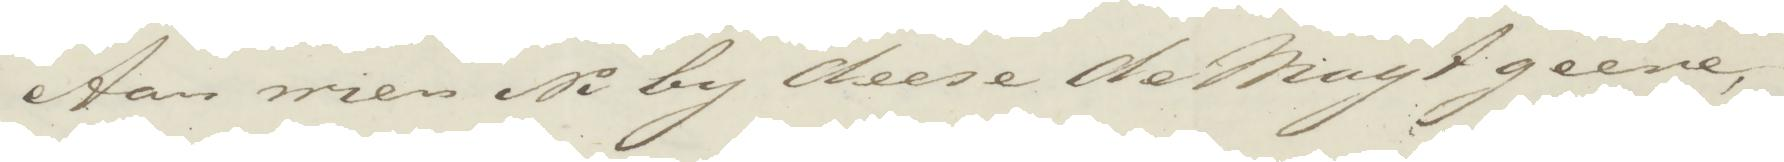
Aan wien ik by deese de magt geeve,
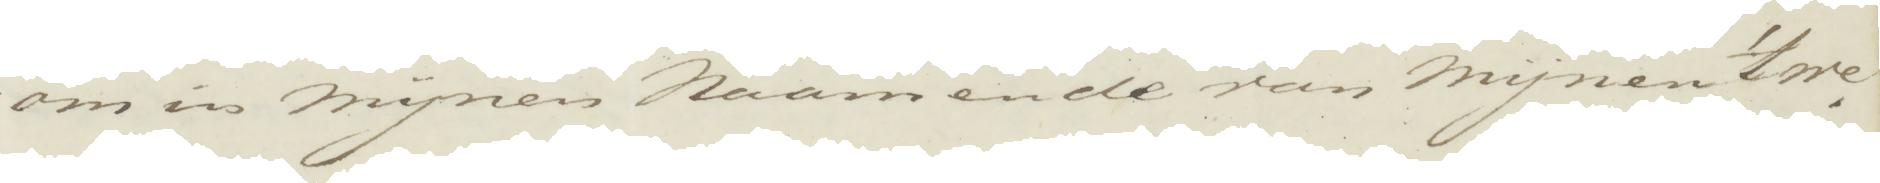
om in mijnen naamen de van mijnen 't we
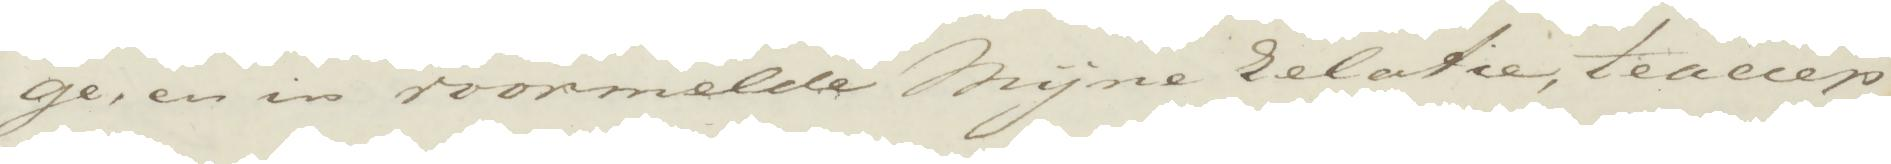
ge, en in voormelde mijne relatie, te accep
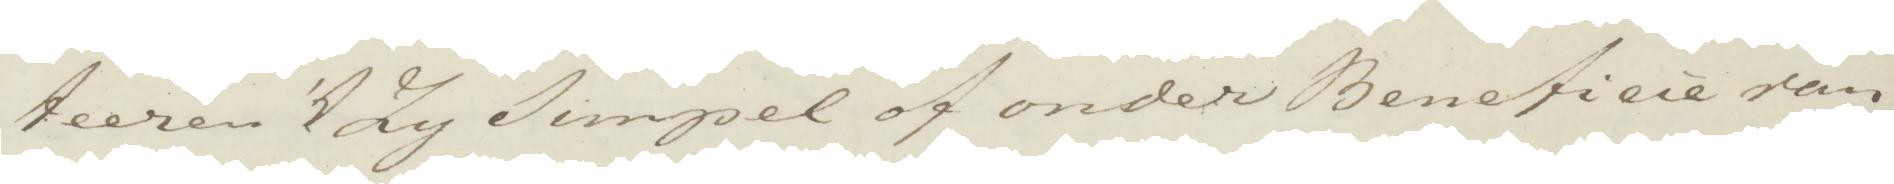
teeren 't Zy simpel of onder Beneficie van
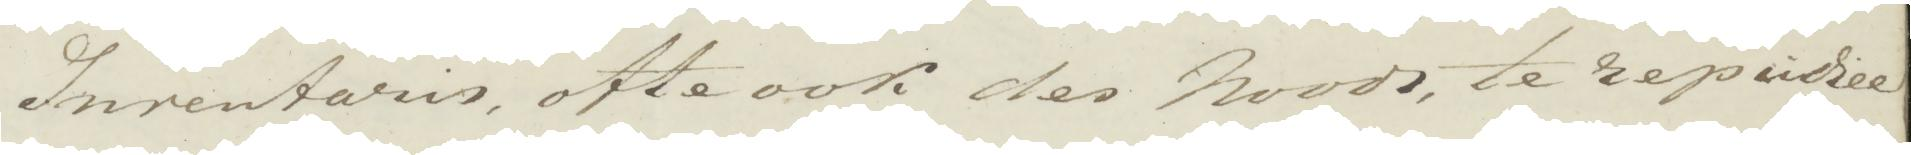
Inventaris, ofte ook des noods, te repudiee
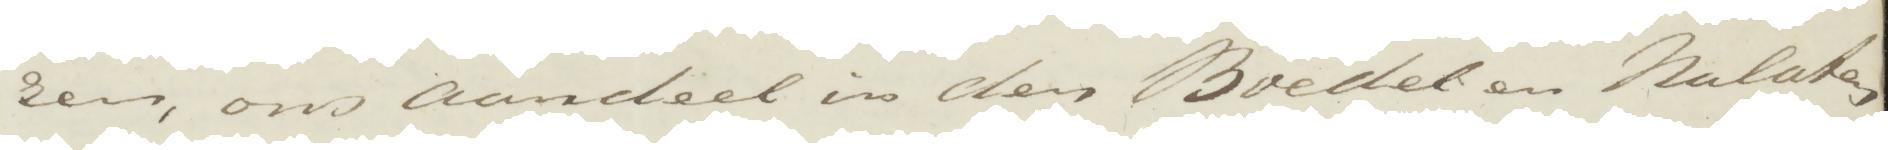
ren, ons aandeel in den Boedel en Nalaten
